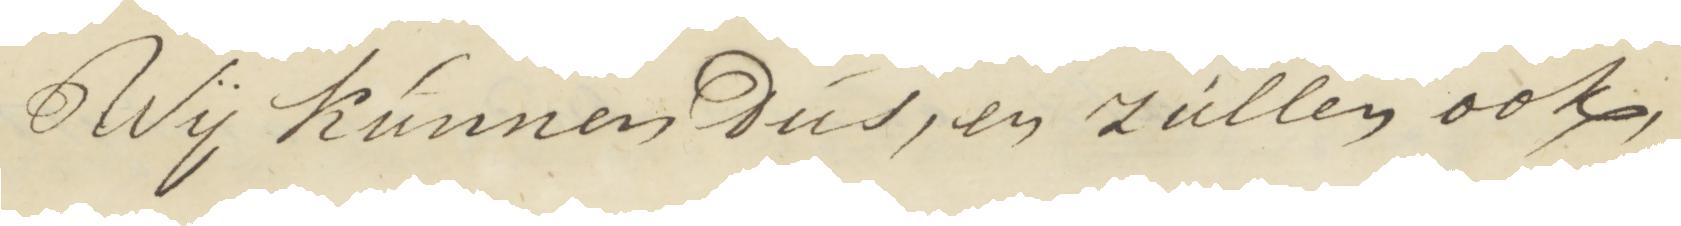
Wij kunnen dus, en zullen ook,
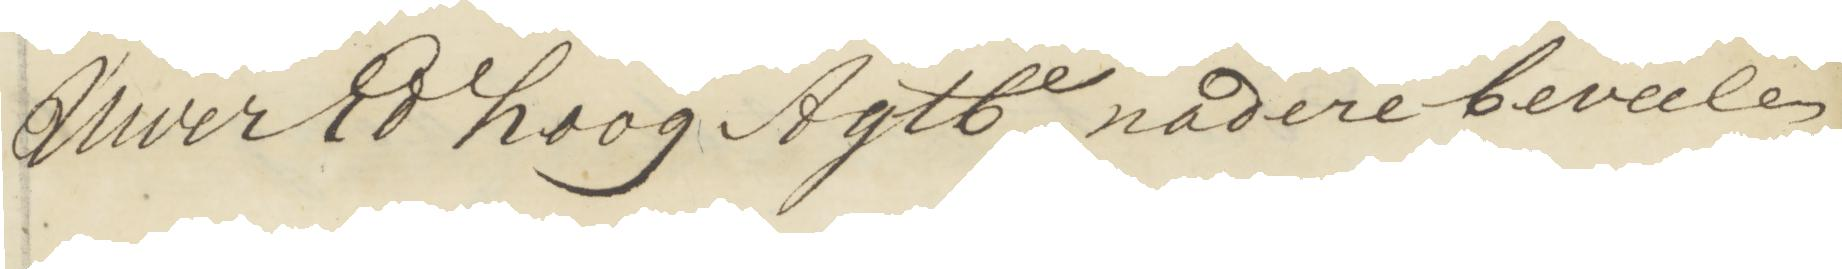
Uwer Ed hoog Agtbe nadere beveelen
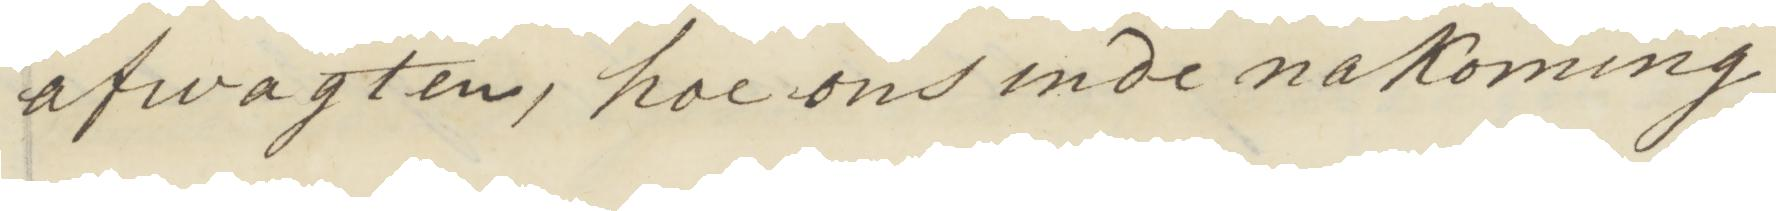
afwagten, hoe ons inde nakoming
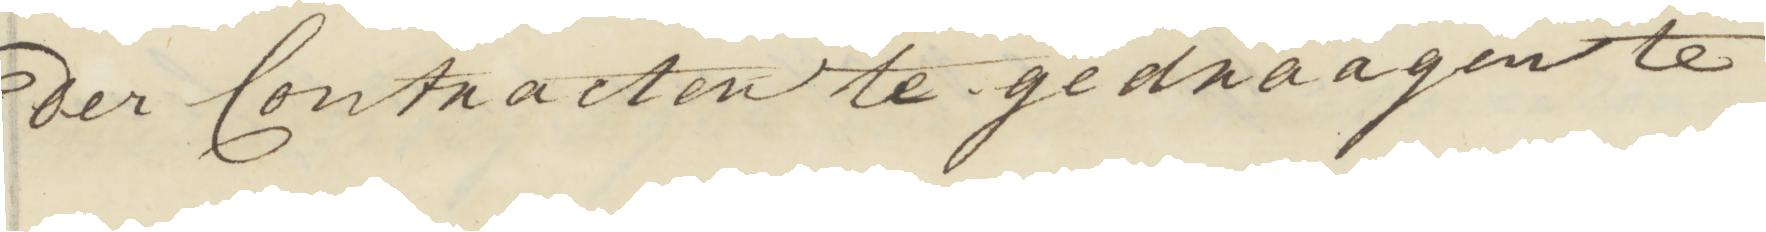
der Contracten te gedraagen te
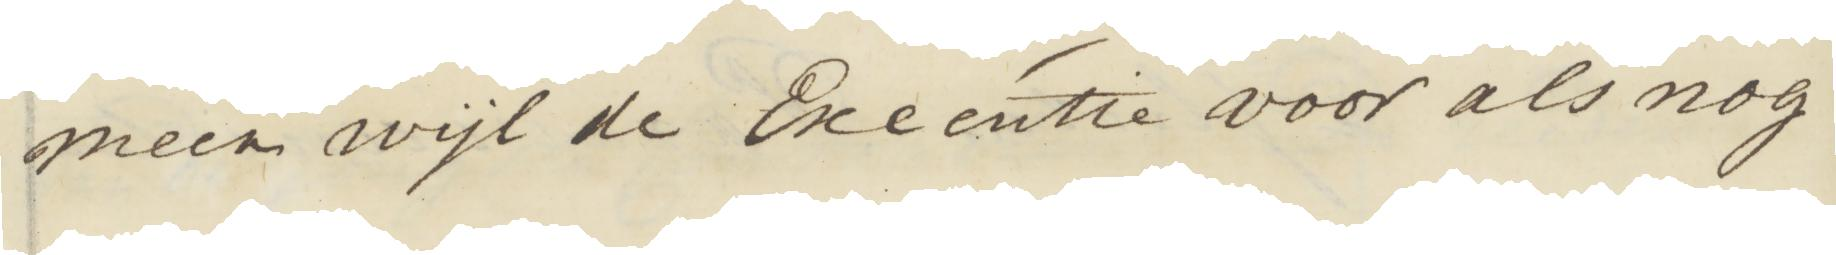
meer wijl de Executie voor als nog
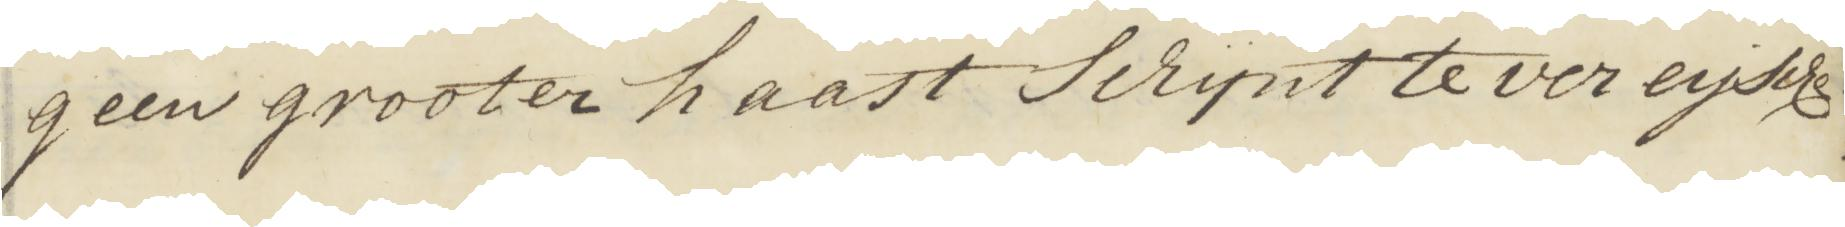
geen grooter haast schijnt te vereijsche
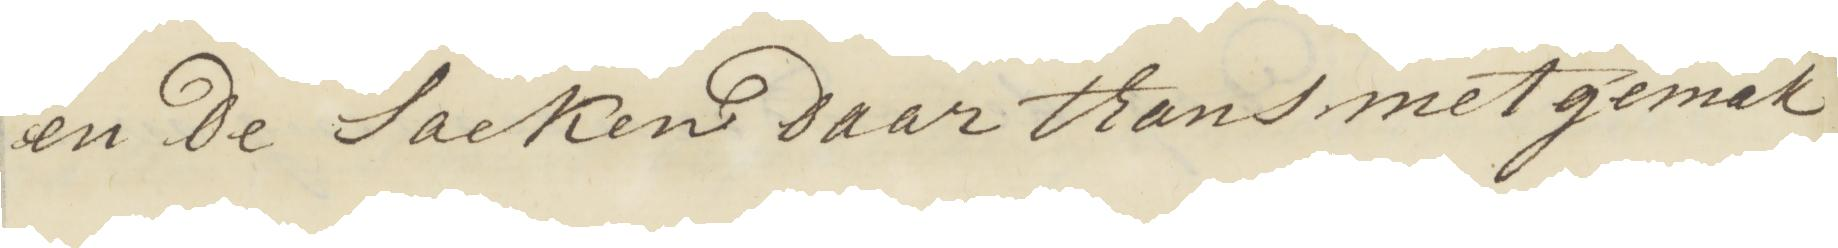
en de saeken daar thans met gemak
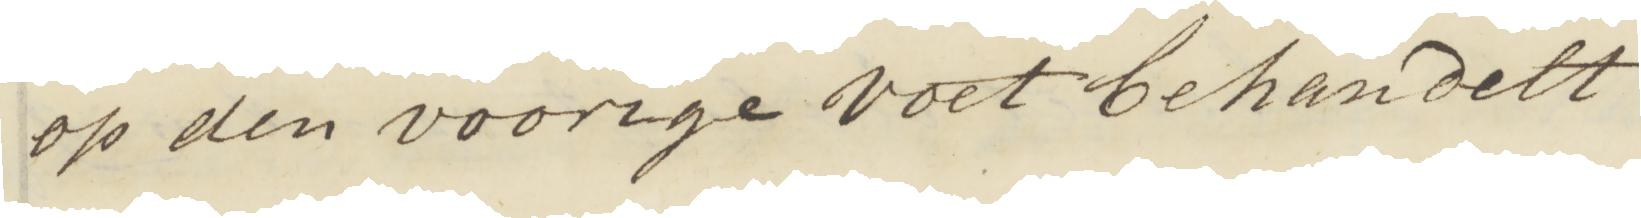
op den voorige voet behandelt
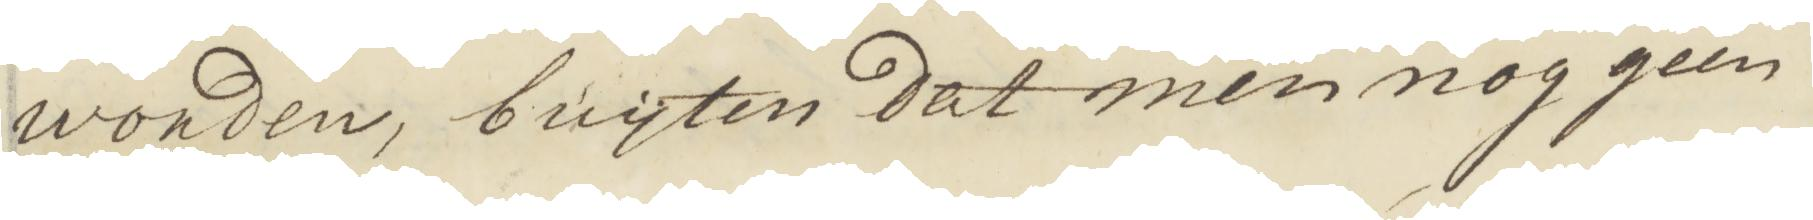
worden, buijten dat men nog geen
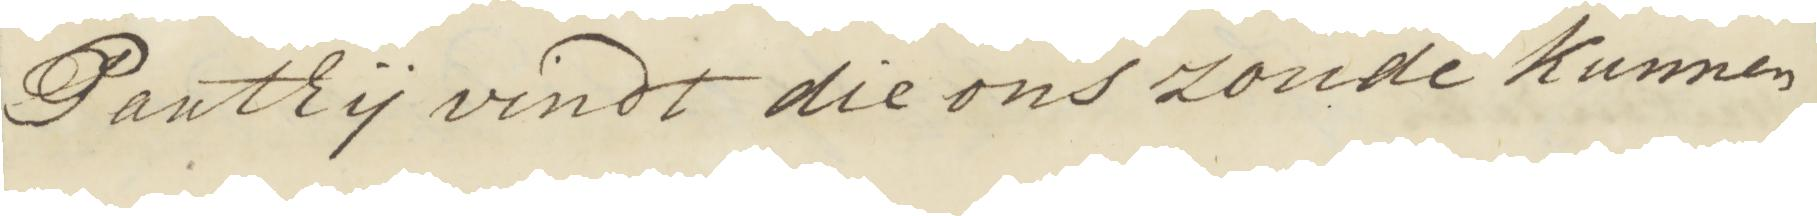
Parthij vindt die ons zoude kunnen
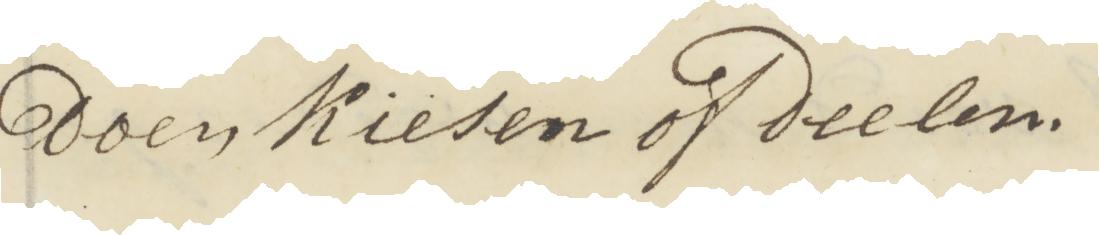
doen kiesen of deelen.
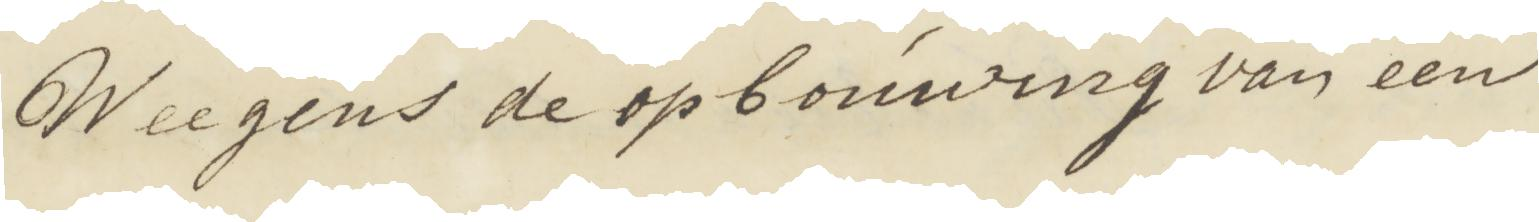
Weegens de op bouwing van een
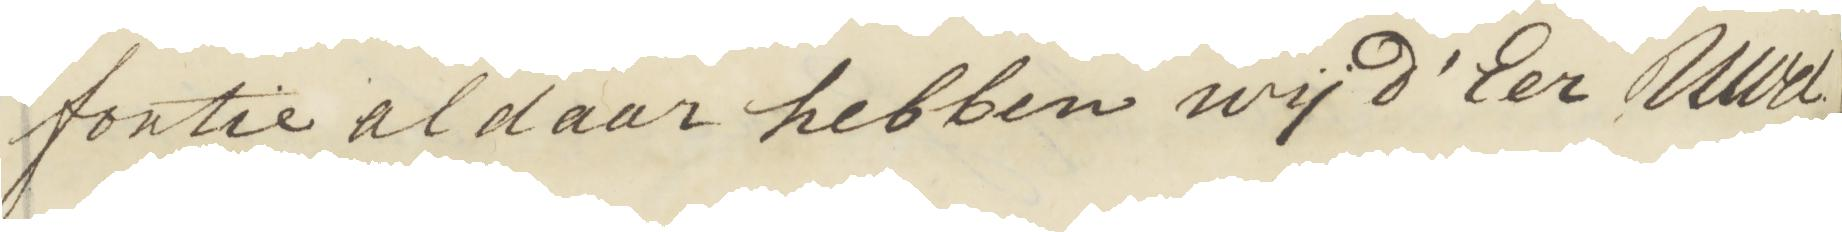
fortie aldaar hebben wij d’ Eer UWel
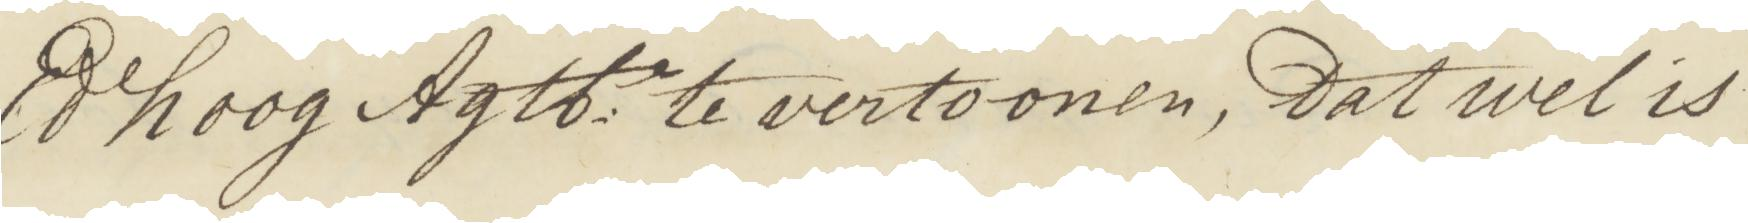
Ede hoog Agtb:e te vertoonen, dat wel is
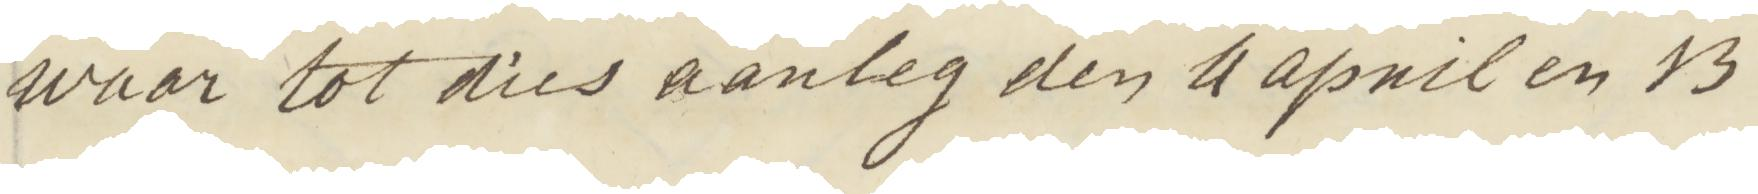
waar tot dies aanleg den 4 april en 13
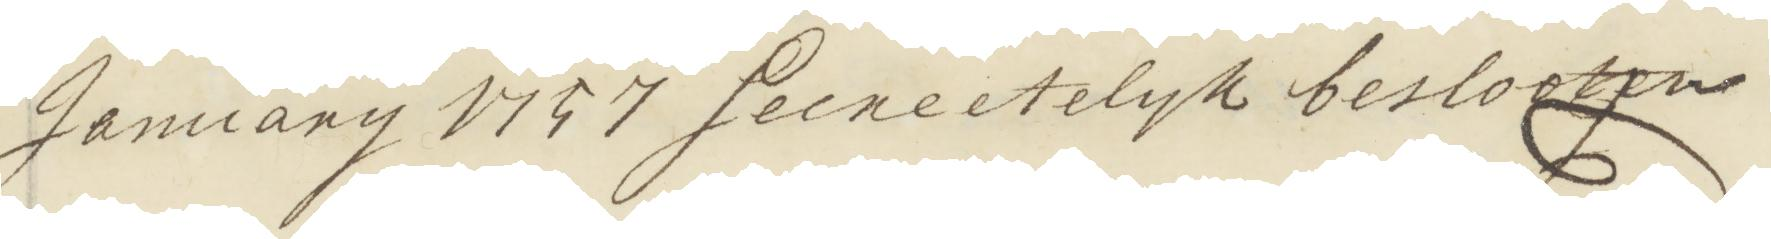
Januarij 1757 secreetelyk beslooten
